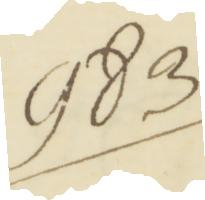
983
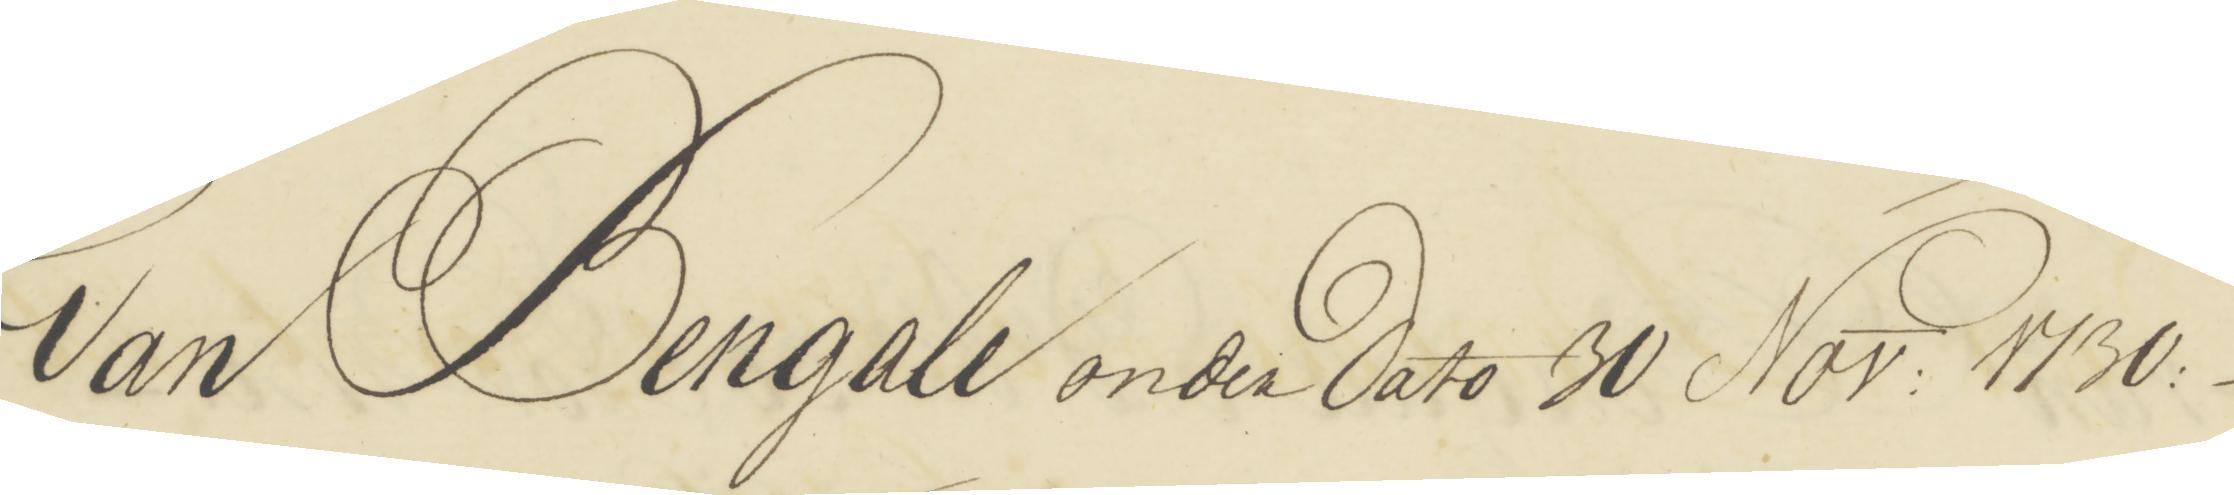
Van Bengale onder dato 30 Nov: 1730:_
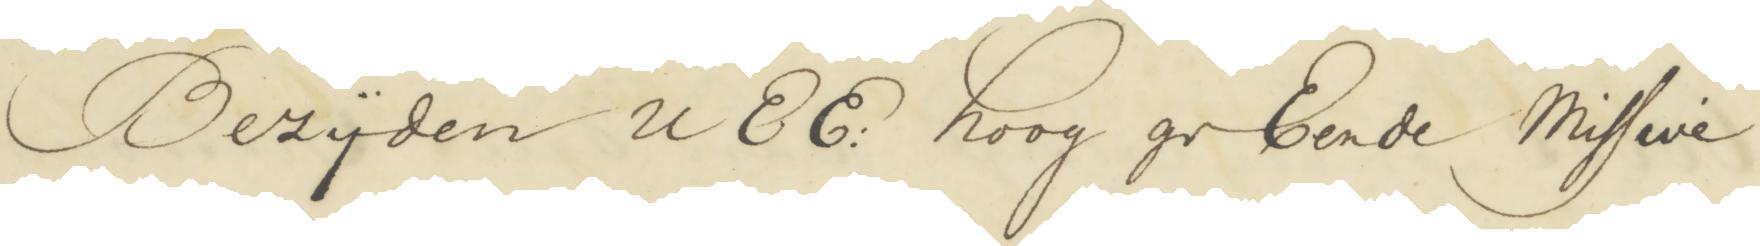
Bezijden u E E: hoog geEerde missive
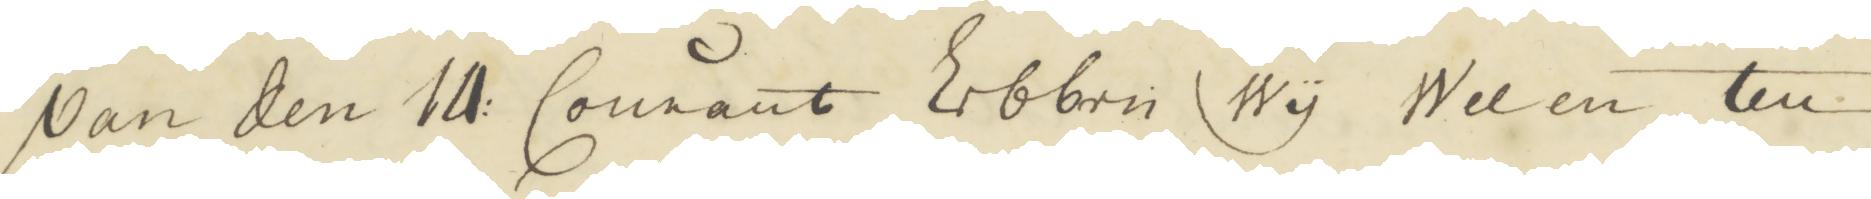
van den 14: Courant hebben wij wel en ten
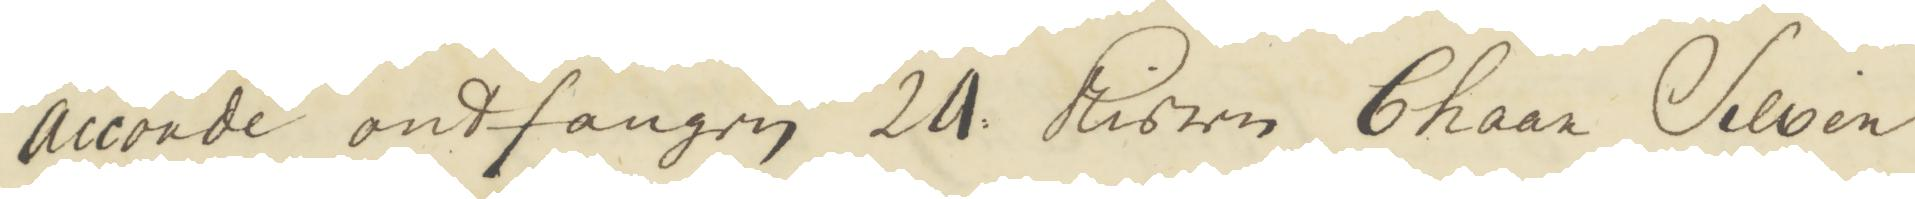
Accorde ontfangen 24: kisten bhaar Selven
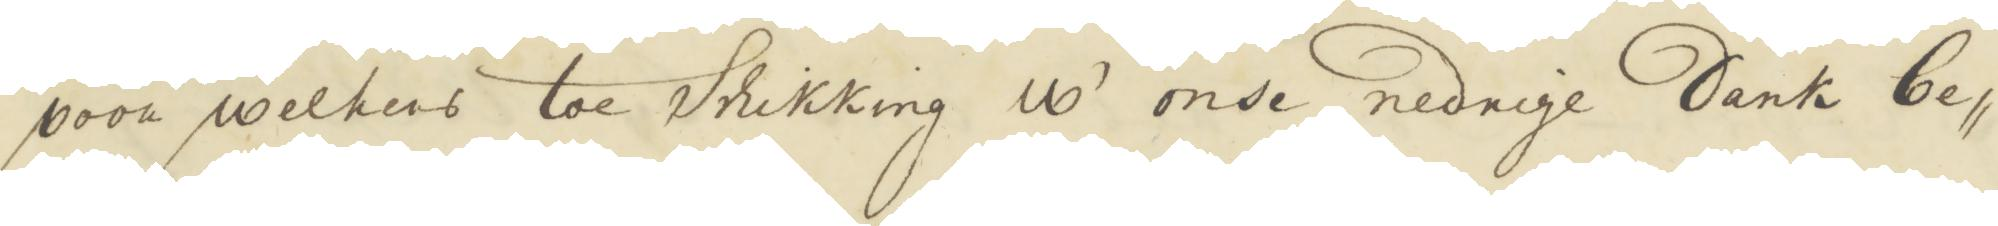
voor welkers toe schikking w' onse nedrige dank be„
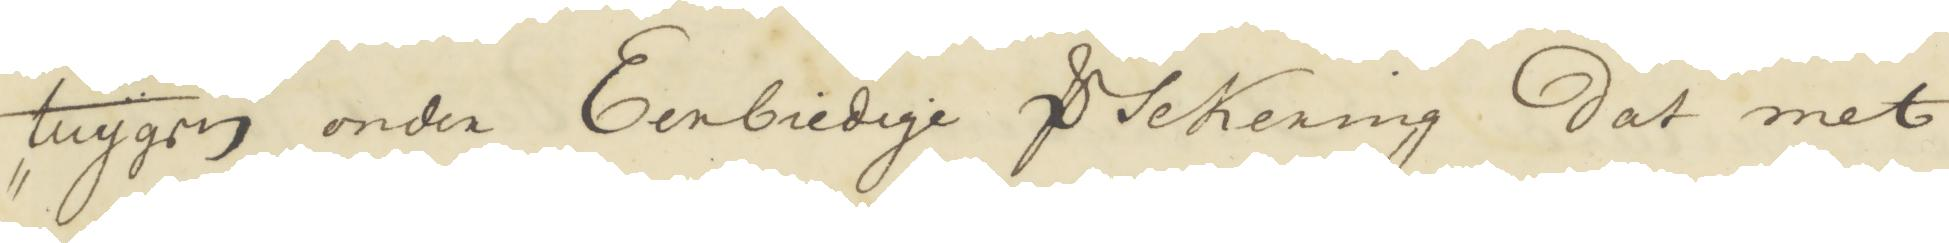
tuijgen onder Eerbiedige versekering dat met
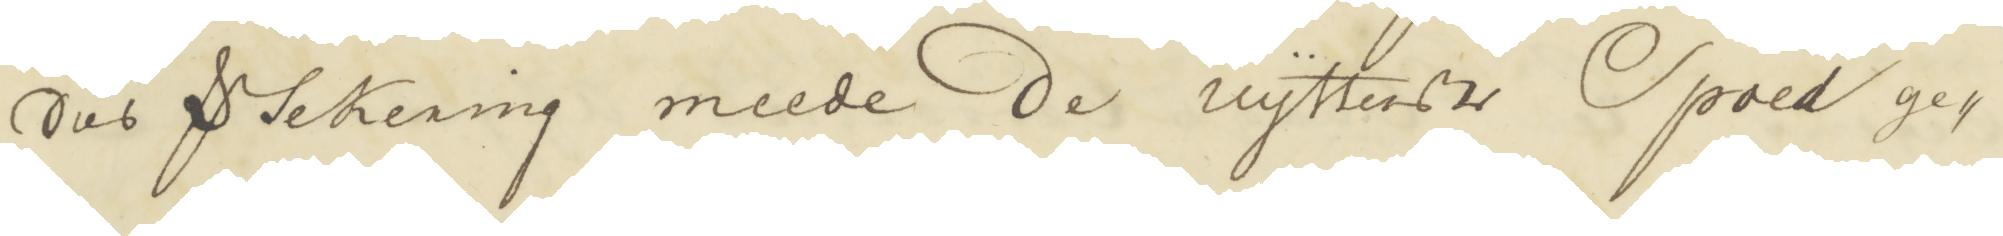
dies versekering meede de uijtterste Spoed ge„
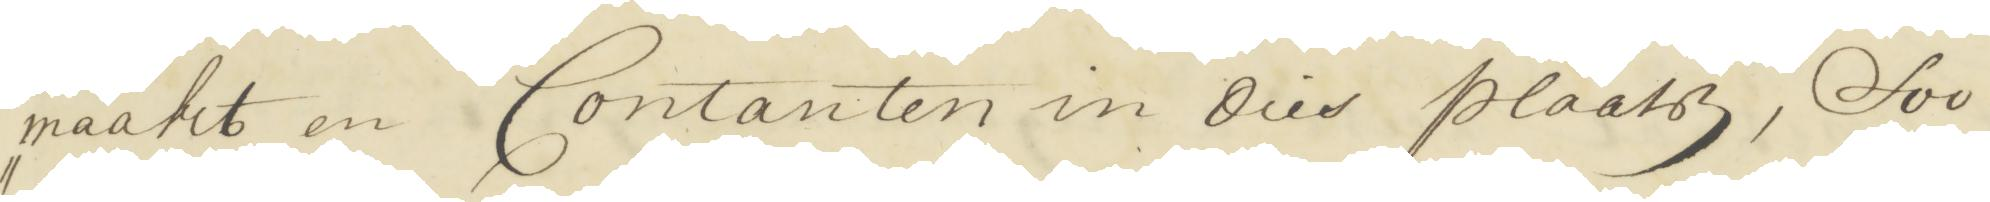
„maakt en Contanten in dies plaatsz, soo
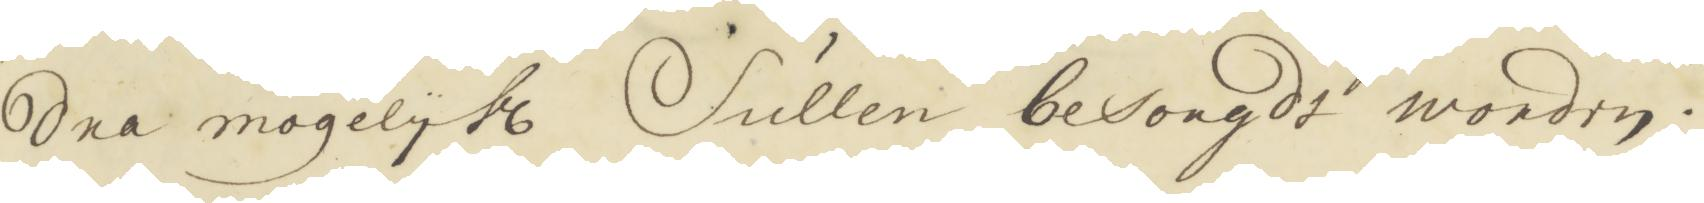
dra mogelijk sullen besorgds worden.
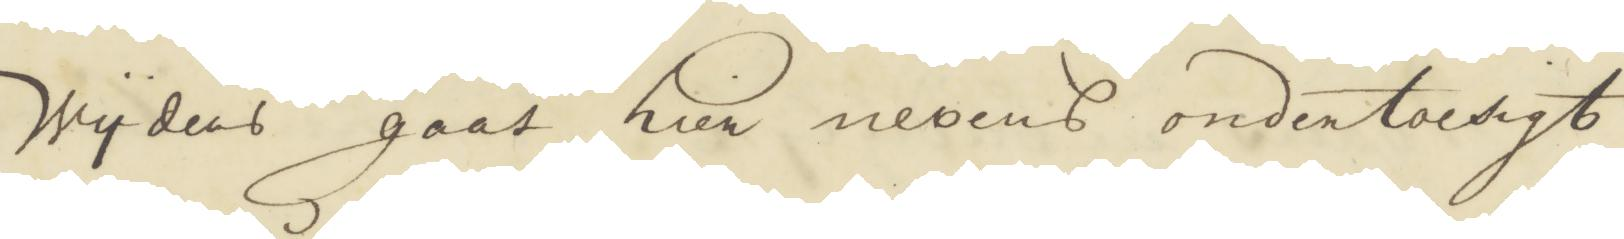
Wijders gaat hier nevens onder toesigt
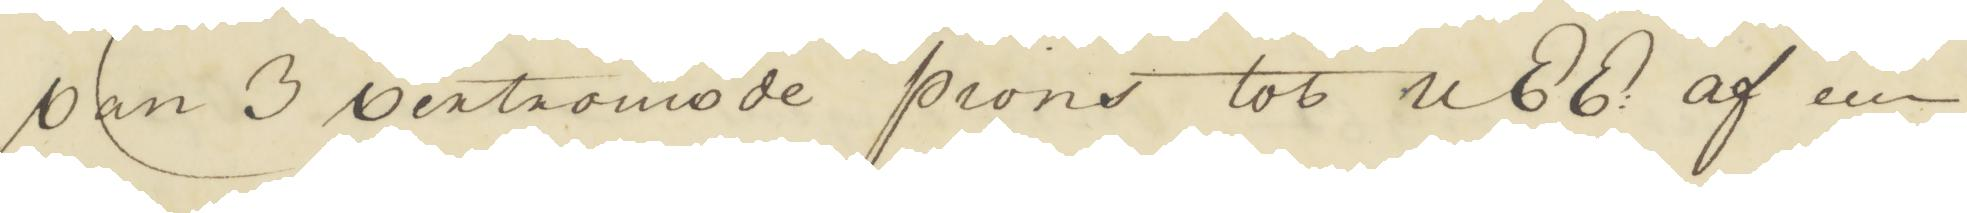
van 3 vertrouwde pions tot U E E: af een
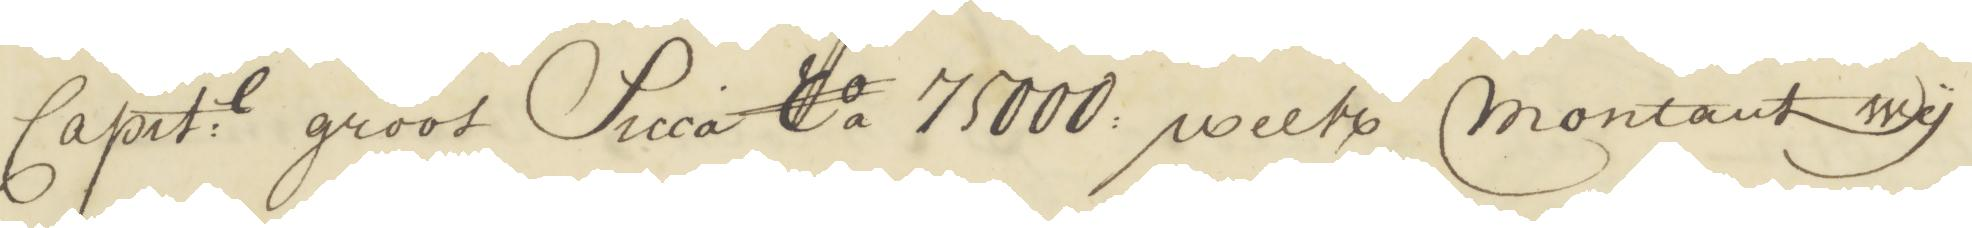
Capit:l groot Sicca Ro=a 75000: week montant wij
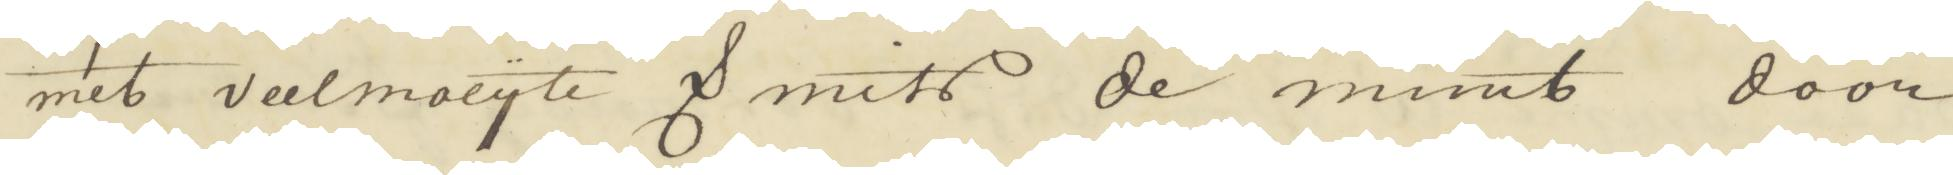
met veel moeijte vermits de munt door
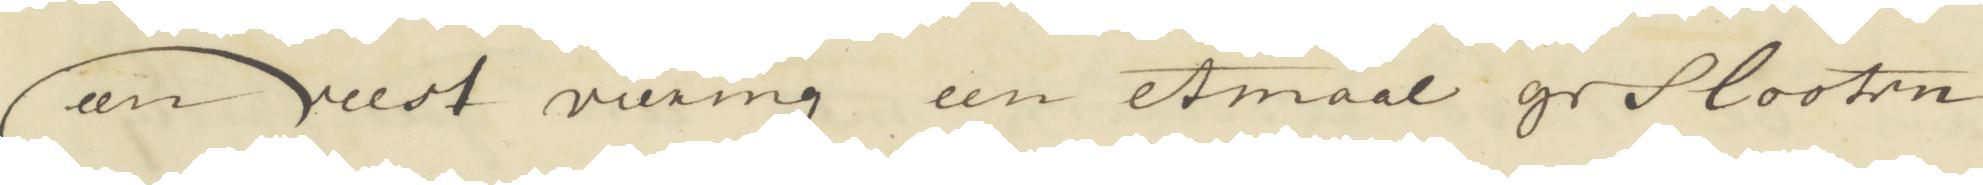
een veest viering een etmaal geslooten
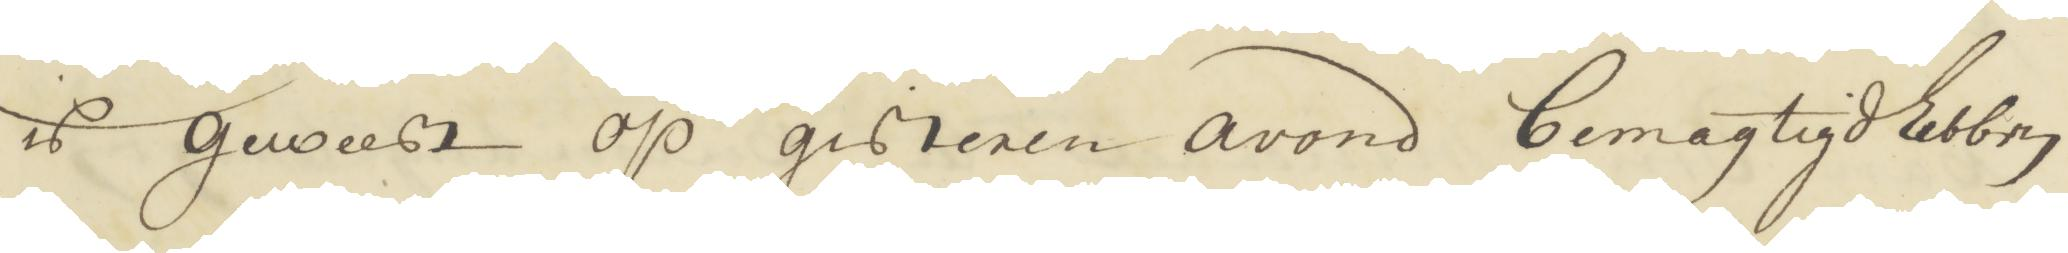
is geweest op gisteren avond bemagtigd hebben
